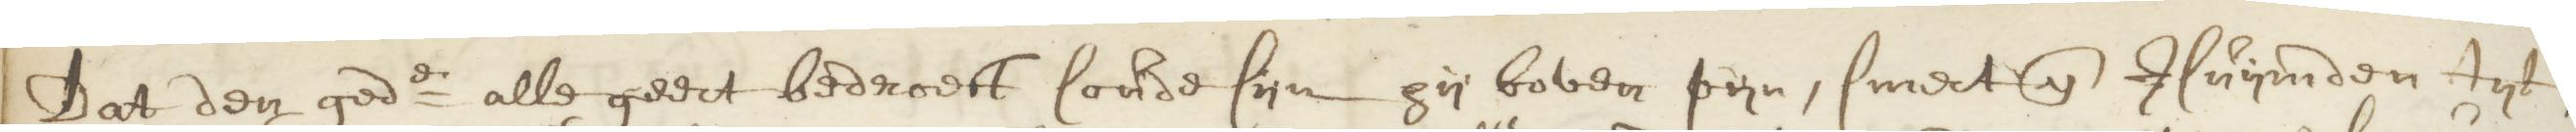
Dat den ged=e alle geert bedroeft soude sijn hij boven pijn, smert ende versuijmden tyt
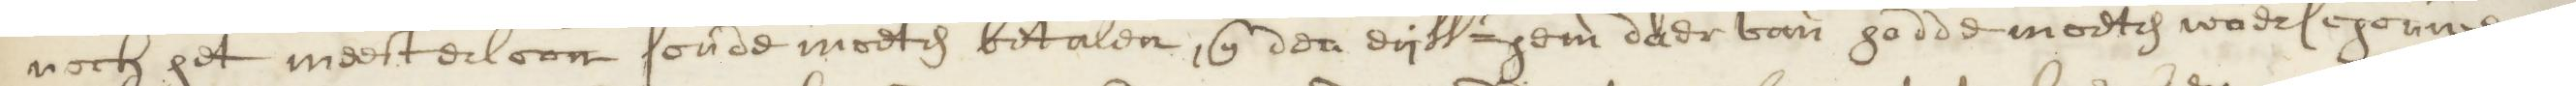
noch het meesterloon soude moeten betalen, ende den eijss=r hem daer van hadde moeten waerschouwen
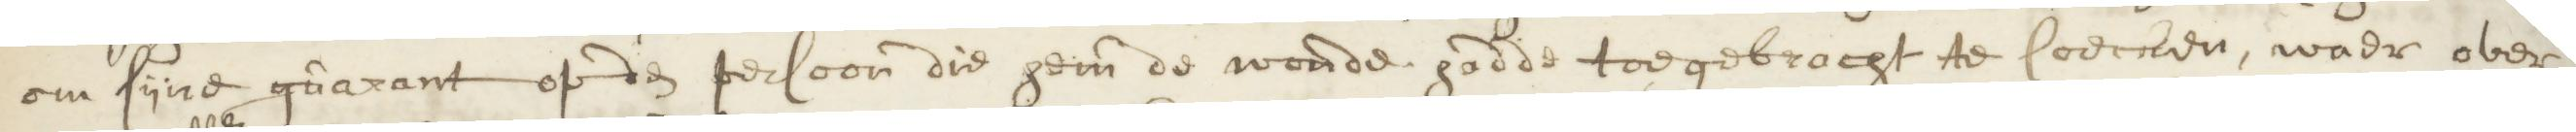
om sijne quarant op den persoon die hem de wonde hadde toegebracht te soeken, waer over
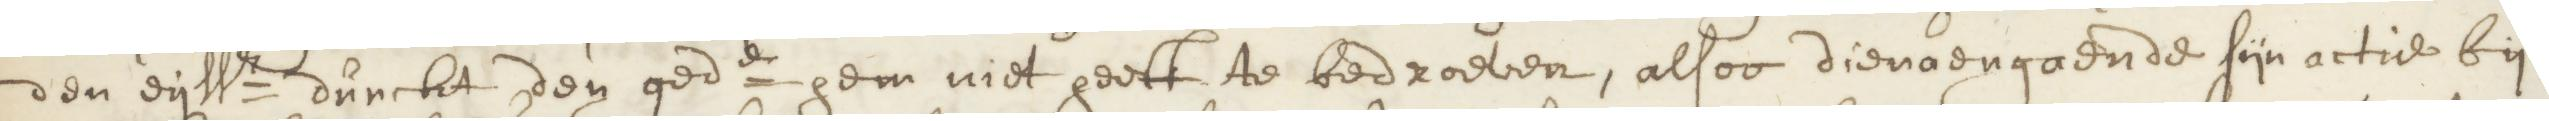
den eijss=r dunckt den ged=e hem niet heeft te bedroeven, alsoo dienaengaende sijn actie bij
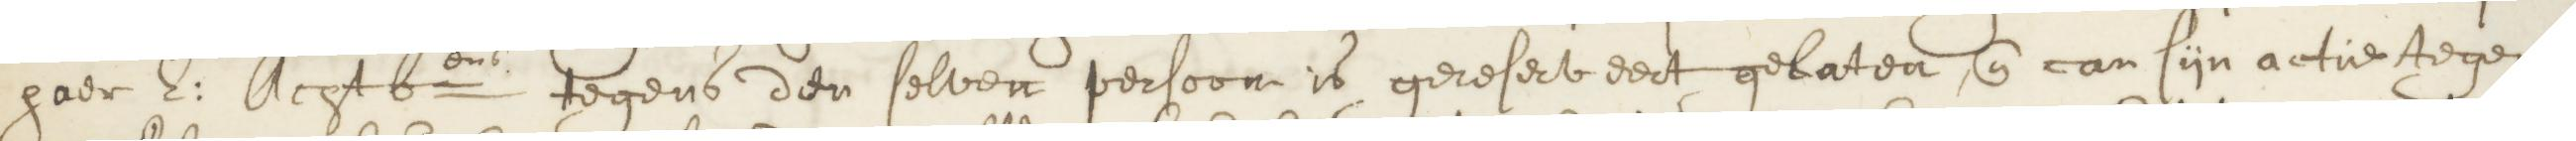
haer E: Agtb=ens tegens den selven persoon is gereserveert gelaten ende can sijn actie tegens
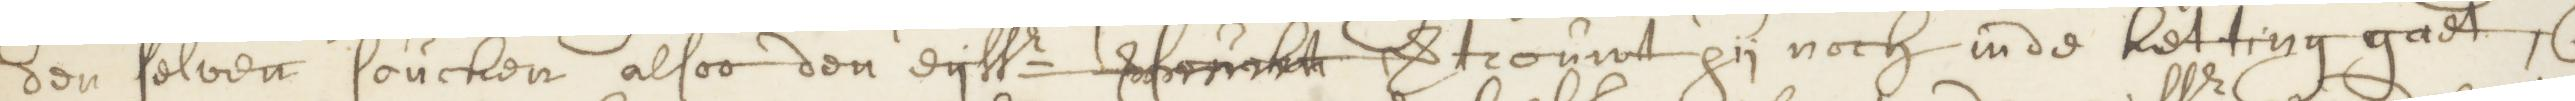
den selven soucken alsoo den eijss=r versouckt vertrouwt hij noch in de ketting gaet, ende
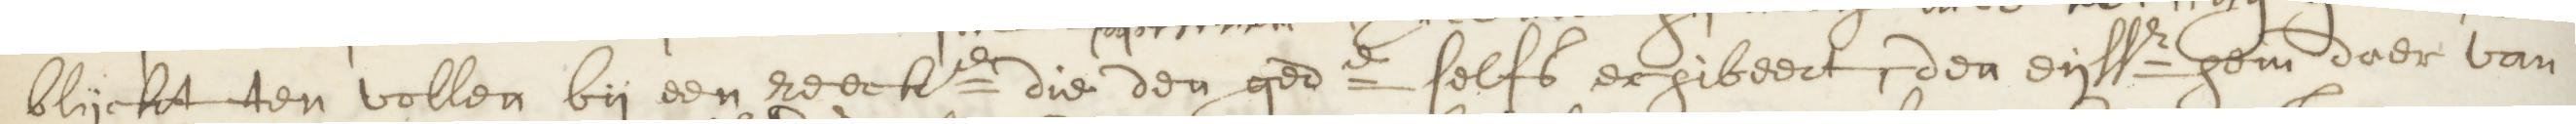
blijckt ten vollen bij een reeck=e die den ged=e selfs exhibeert, den eijss=r hem daer van
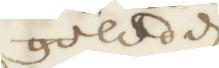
geleden,
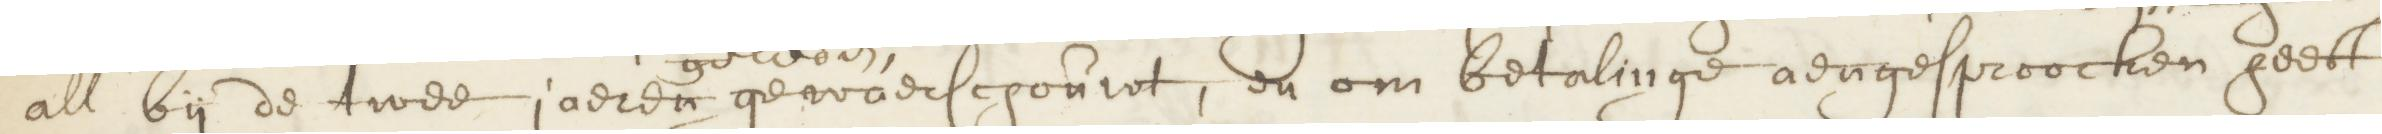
als bij de twee, jaeren gewaerschouwt, en om betalinge aengesproocken heeft
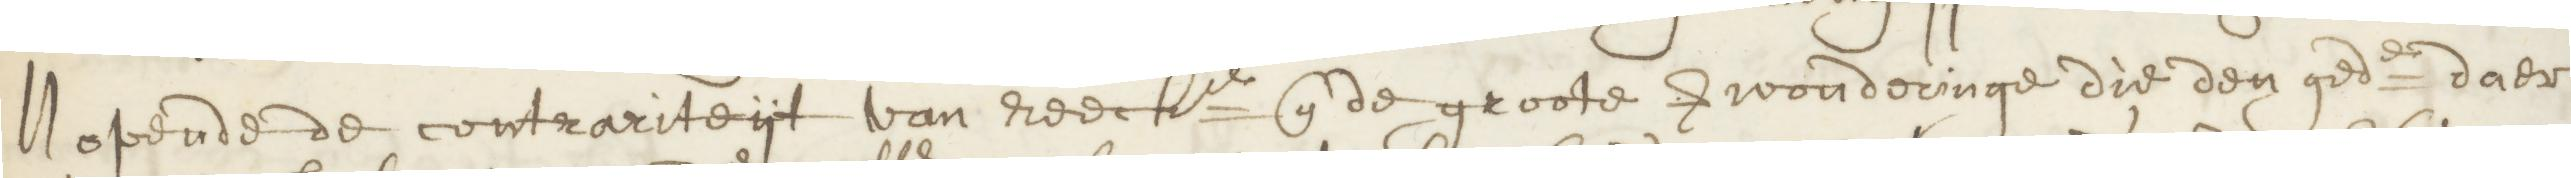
Nopende de contrariteijt van reeck=e ende de groote verwonderinge die den ged=e daer
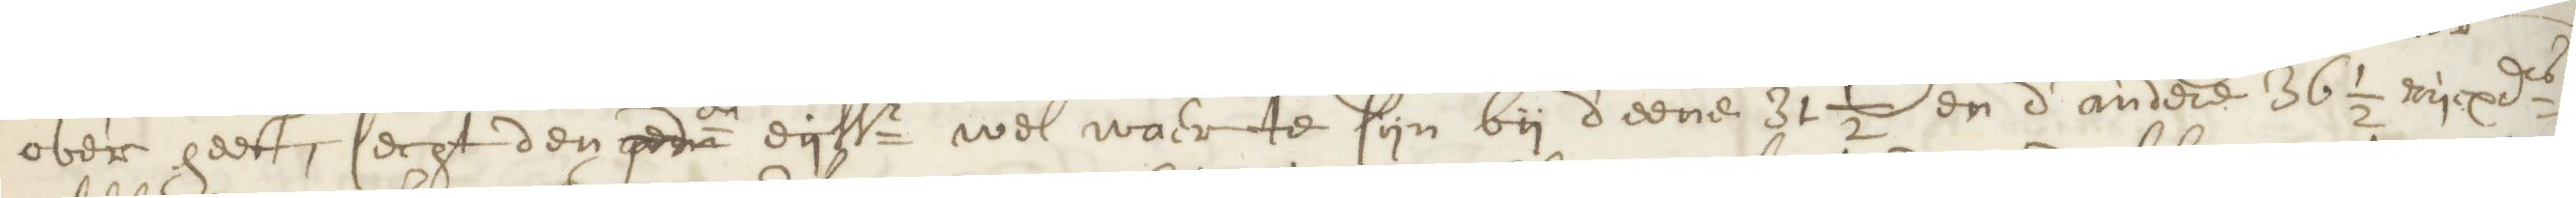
over heeft, secgt den ged=e eijss=r wel waer te sijn bij d' eene 31 1/2 en d’ andere 36 1/2 rijcxd=rs
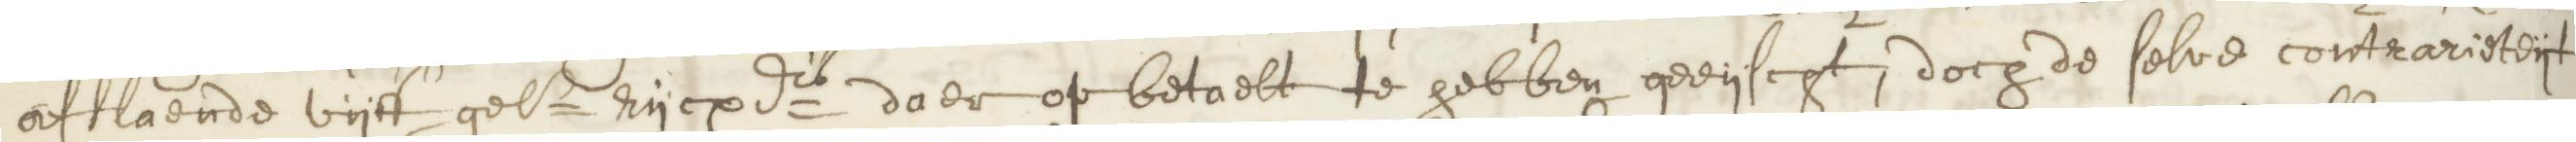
afslaende vijff gelijk rijcxd=rs daer op betaelt te hebben geeijscht, doch de selve contrarieteijt
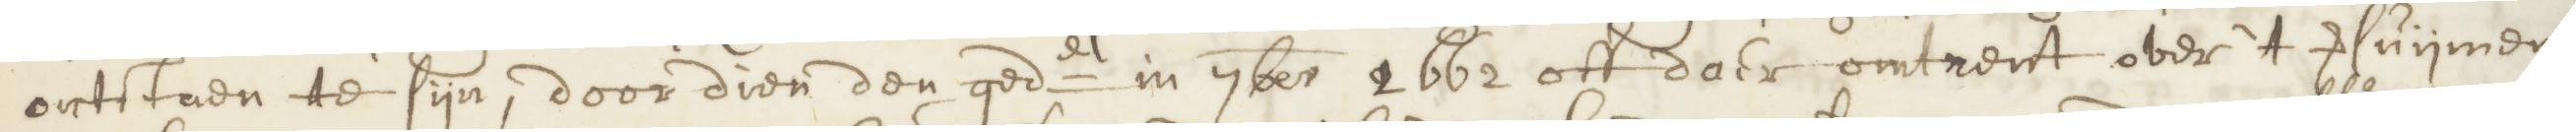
ontstaen te sijn, door dien den ged=e in 7ber 1662 off daer omtrent over ’t versuijmen
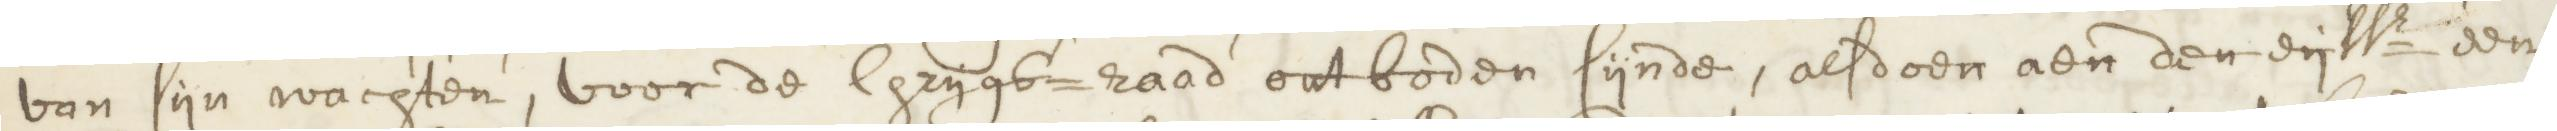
van sijn wachten, voor de chrijgs=raad ontboden sijnde, alsdoen aen den eijss=r een
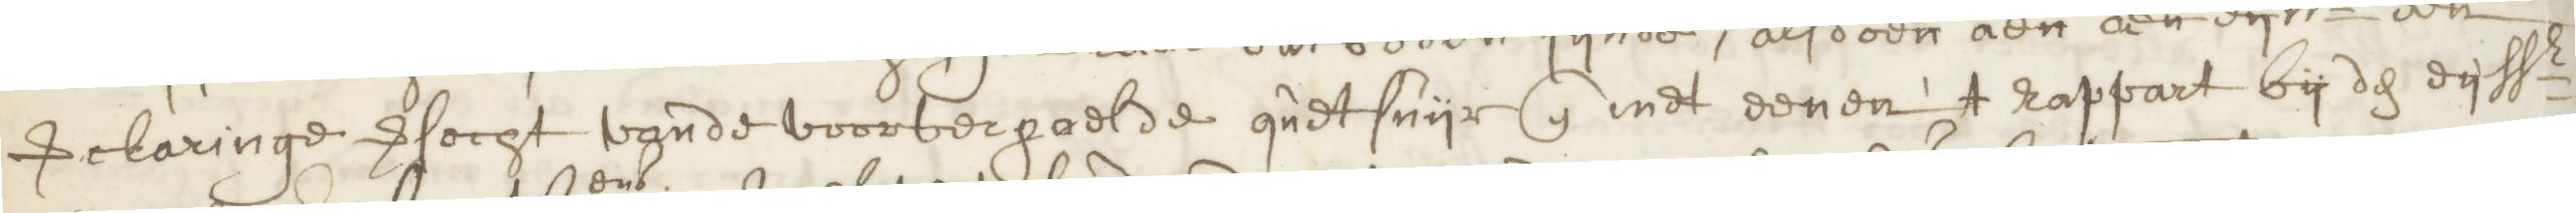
verclaringe versocht van de voorverhaelde quetsuijr ende met eenen ’t rappart bij den eijss=r
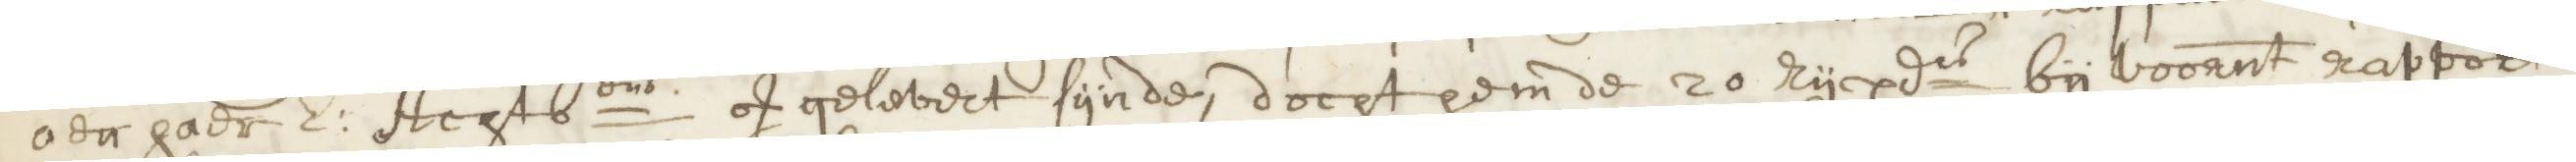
aen haer E: Aegtb=ens of gelevert sijnde, docht hem de 20 rijcxd=rs bij voornt rapport
